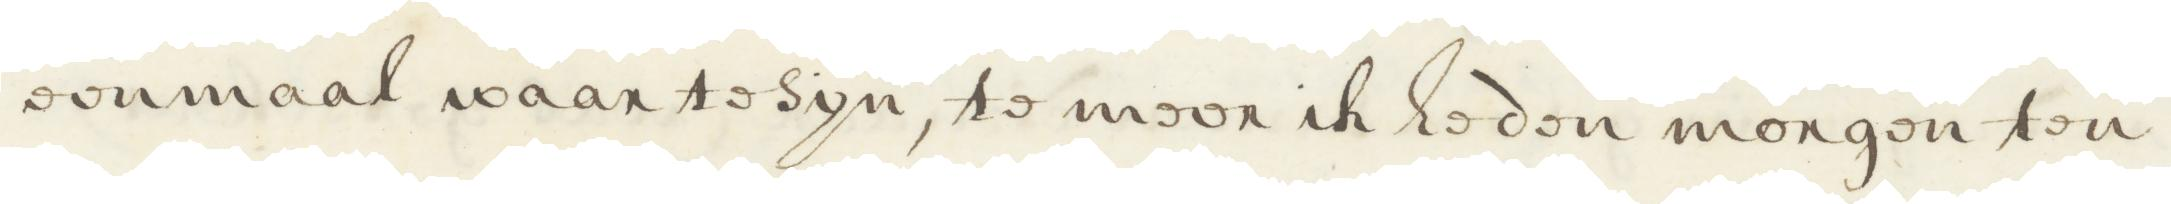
eenmaal waar tesijn, te meer ik heden morgen ten
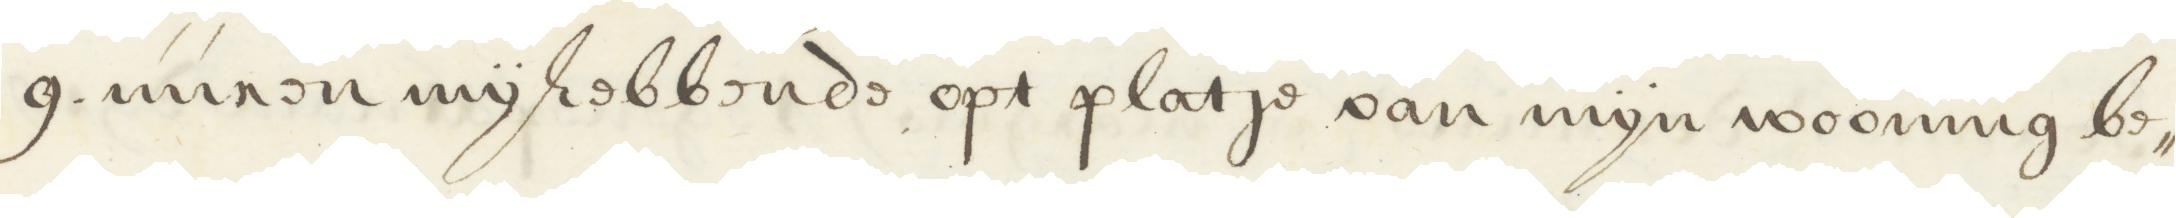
9. uuren mij hebbende opt platje van mijn wooning be„
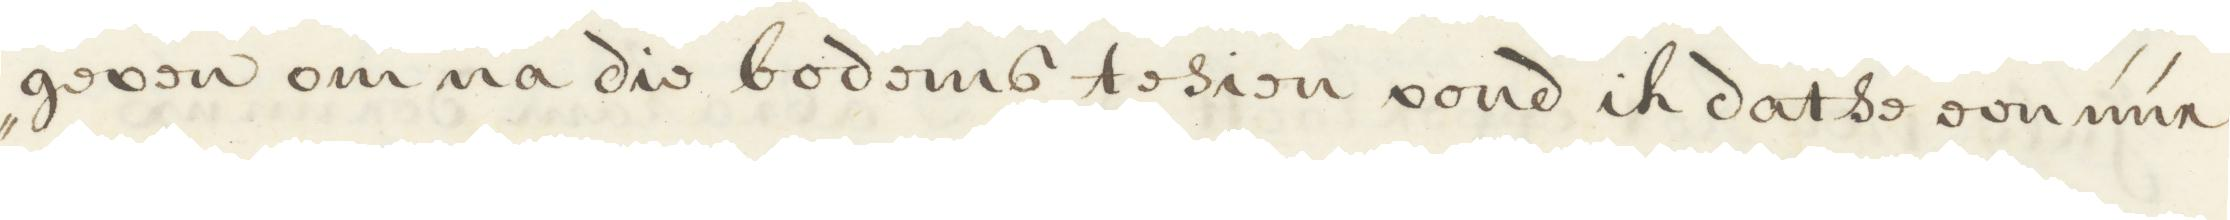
„geven om na die bodems te sien vond ik dat se een uur
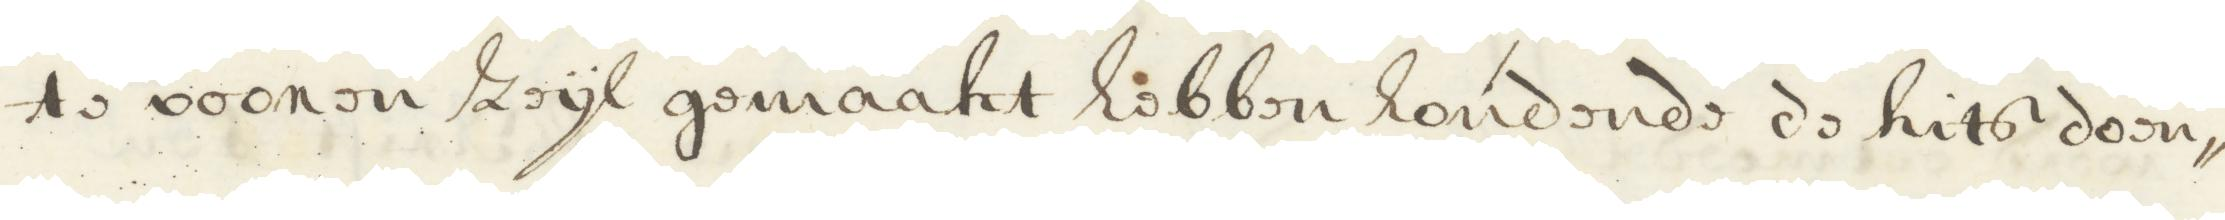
te vooren zeijl gemaakt hebben houdende de kits doen„
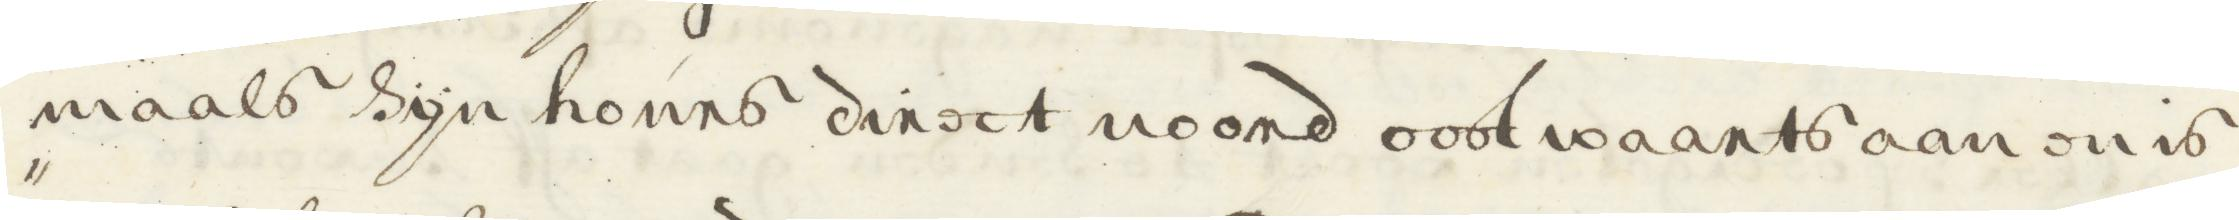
„maals sijn kours direct noord oost waarts aan en is
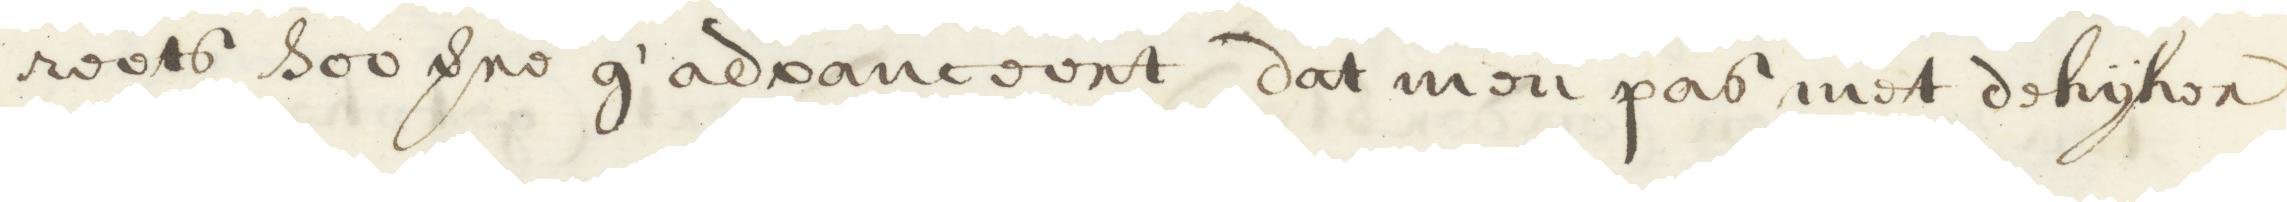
reets soo verre g’advanceert dat men pas met de kijker
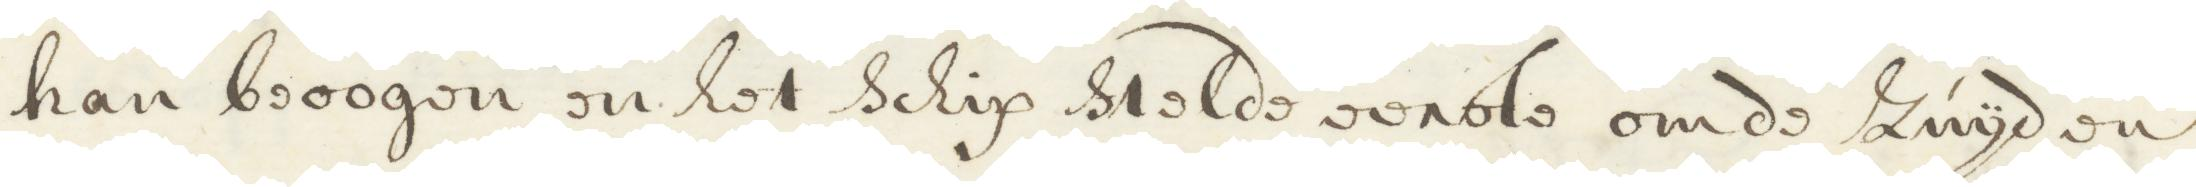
kan beoogen, en het schip stelde eerste om de zuijd en
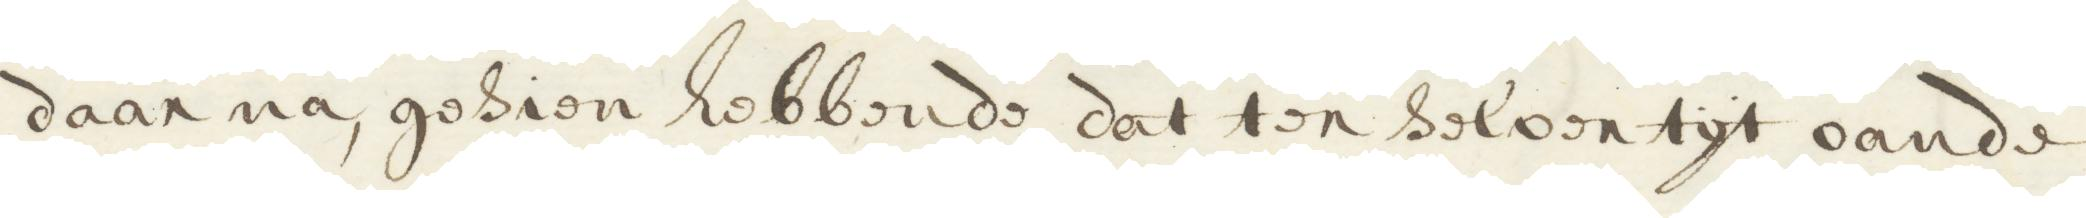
daar na, gesien hebbende dat ter selver tijt van de
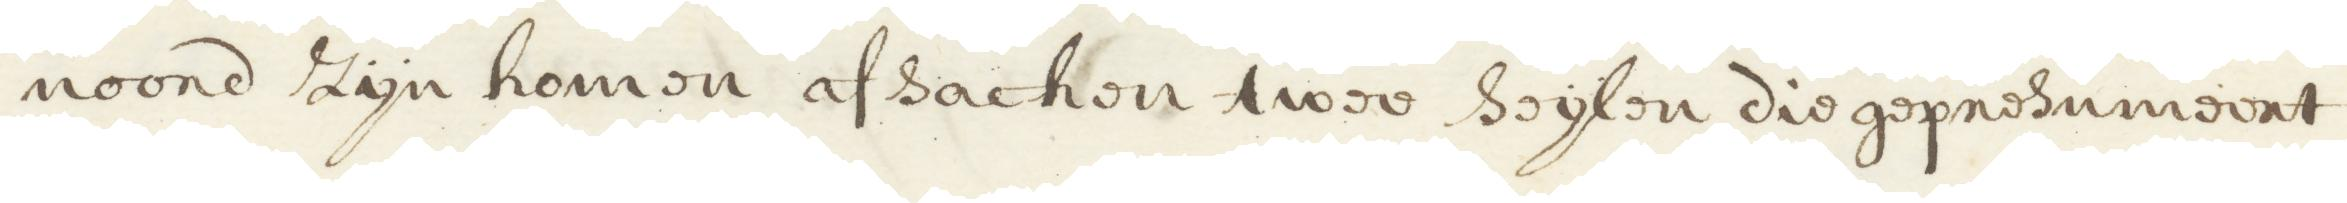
noord zijn komen afsacken twee seijlen, die gepresumeert
